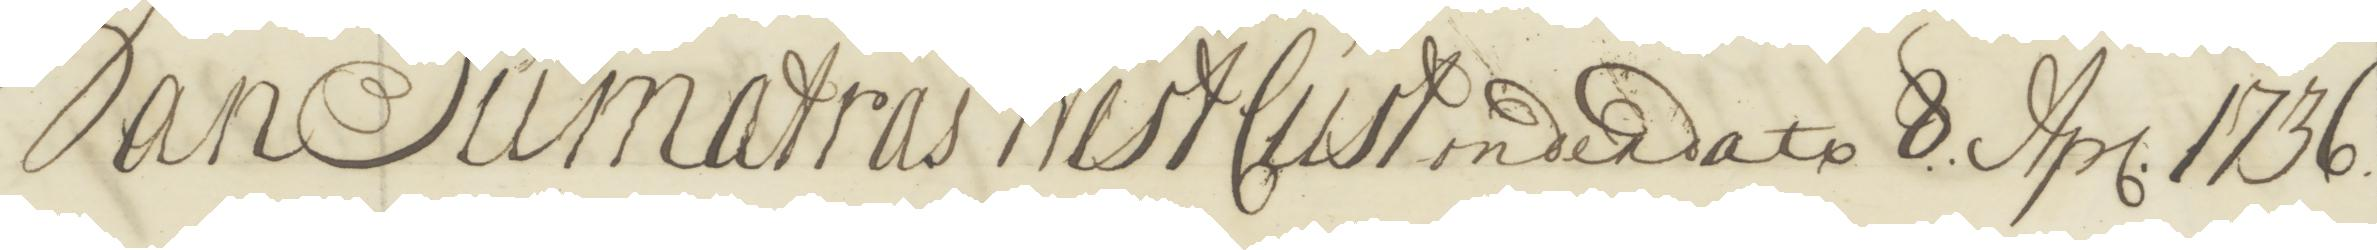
Van Sumatras West Cust onderdato 8. Apr„ 1736.
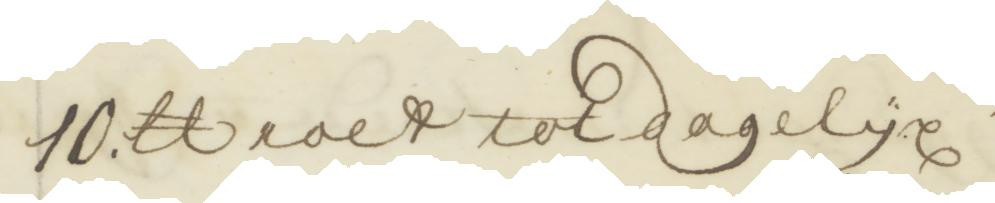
10 lb roet tot dagelijx
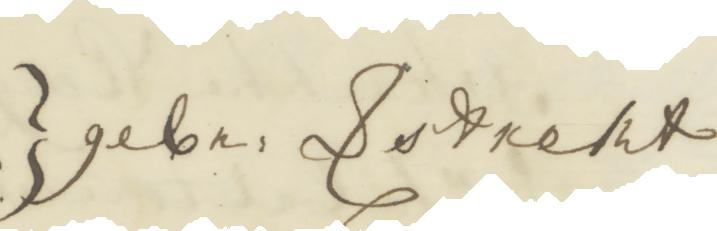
gebr: verstrekt
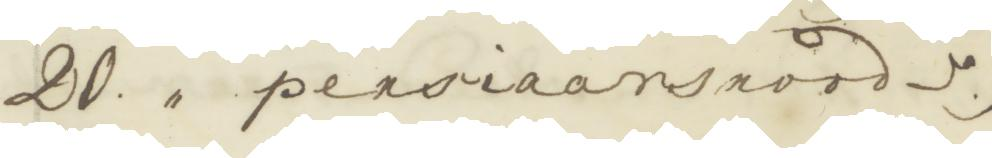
20. „ persiaans rood _o
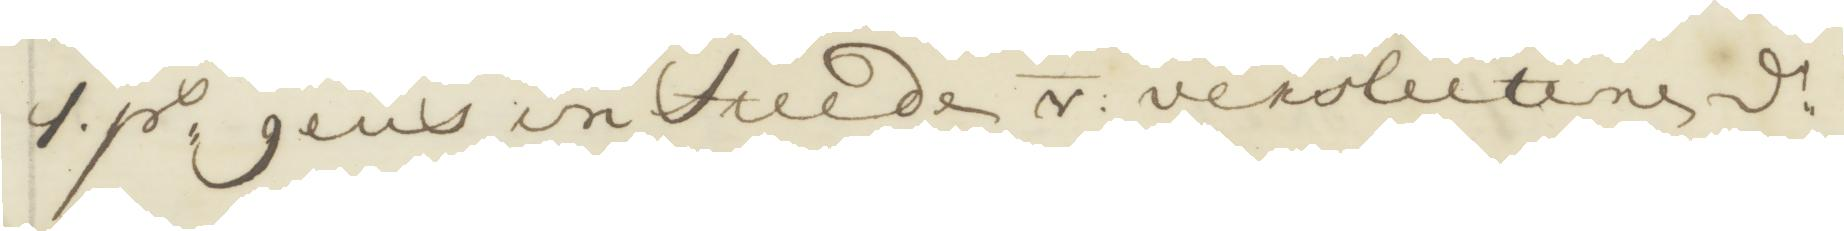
1. p„s geus in steede v: versleetenen _„o
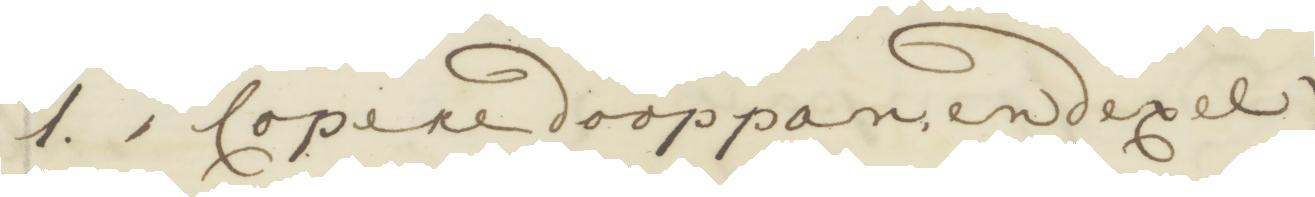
1.„ Copere dooppan en dexel
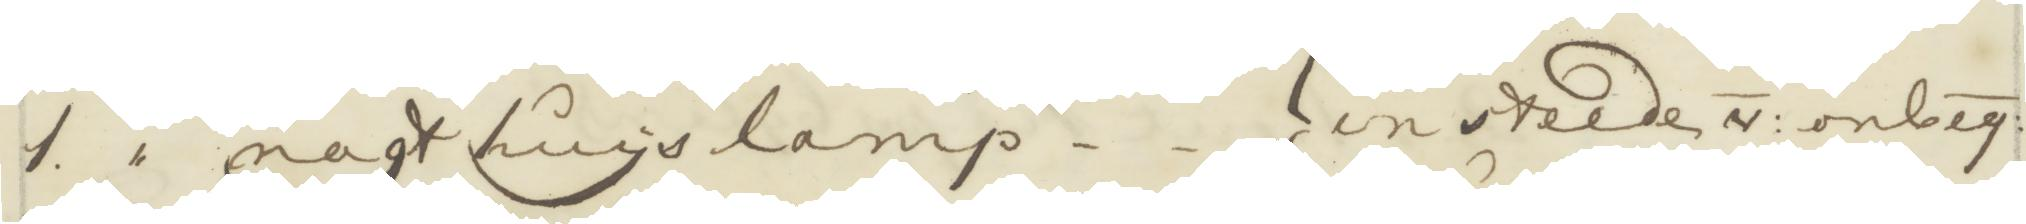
1.„ nagt huijs lamp - - - in steede v: onbeq:
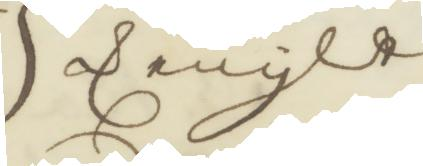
verruijlt
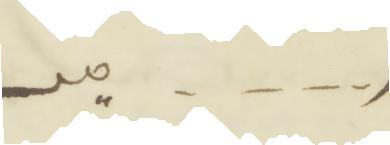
_„o - - - -
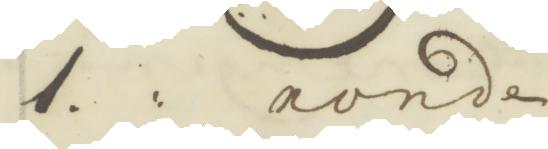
1. „ ronde
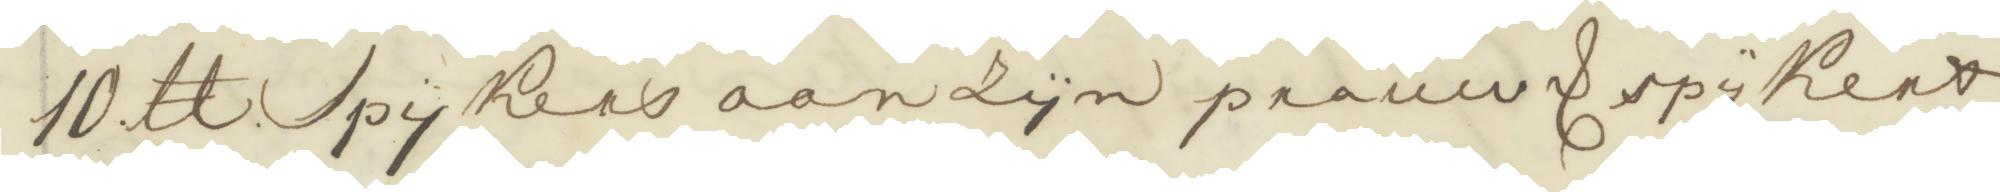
10. lb spijkers aan zijn prauw verspijkert
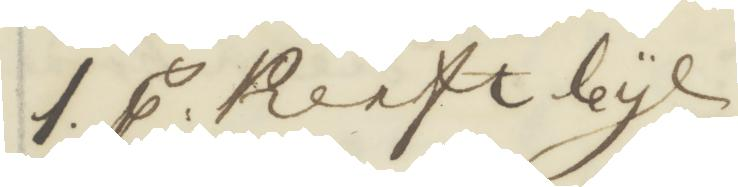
1. p:s Kerft beijl _ _ _
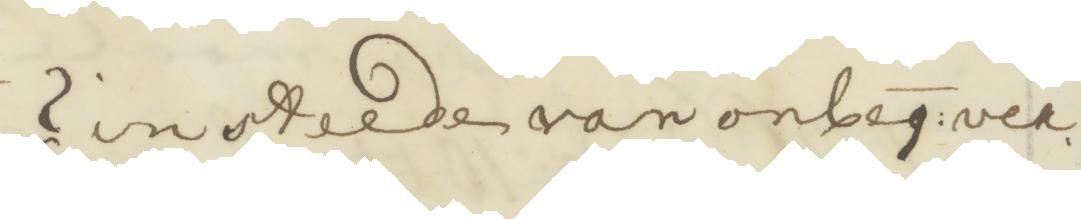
1. in steede van onbeq: ver
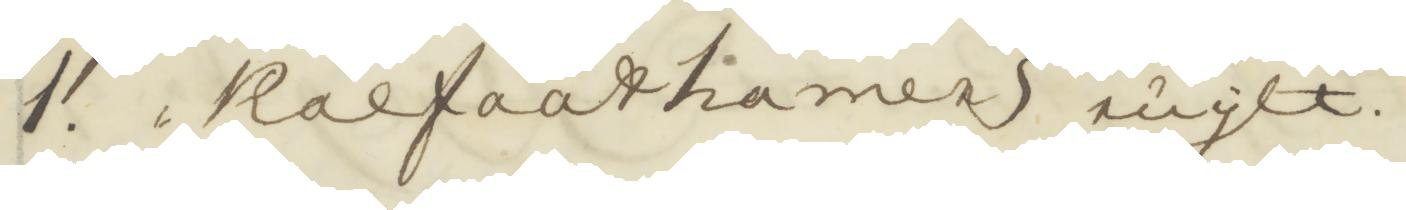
1. Kalfaathamer } ruijlt.
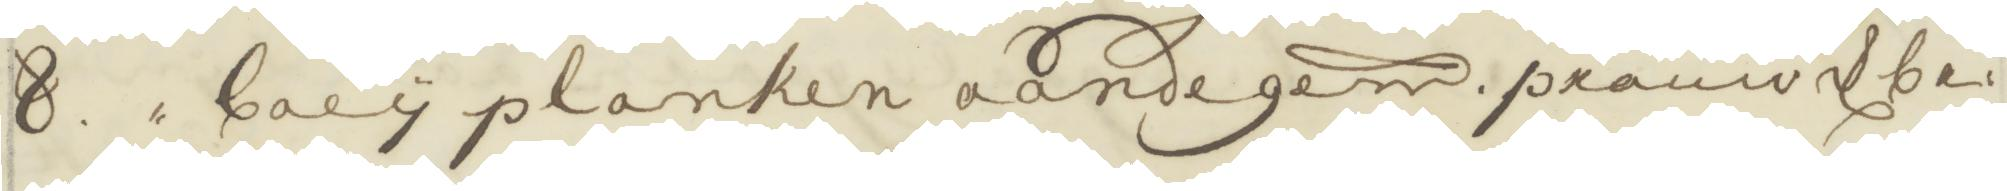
8. „ baeij planken aan de gem. prauw verbr:
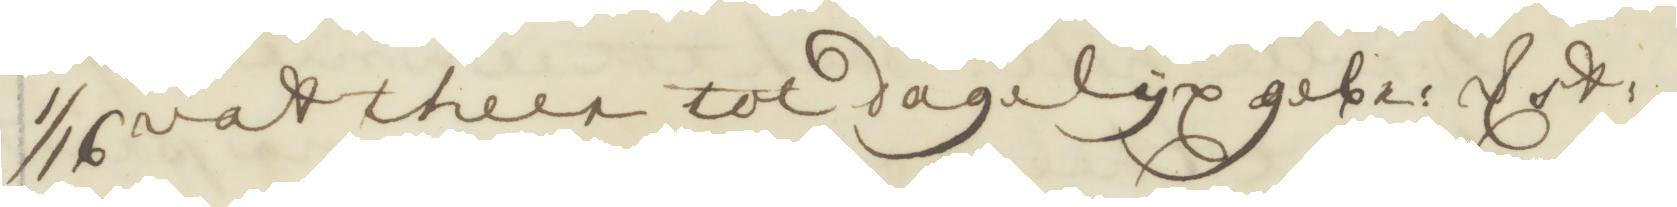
1/16 vat theer tot dagelijx gebr: verst:
